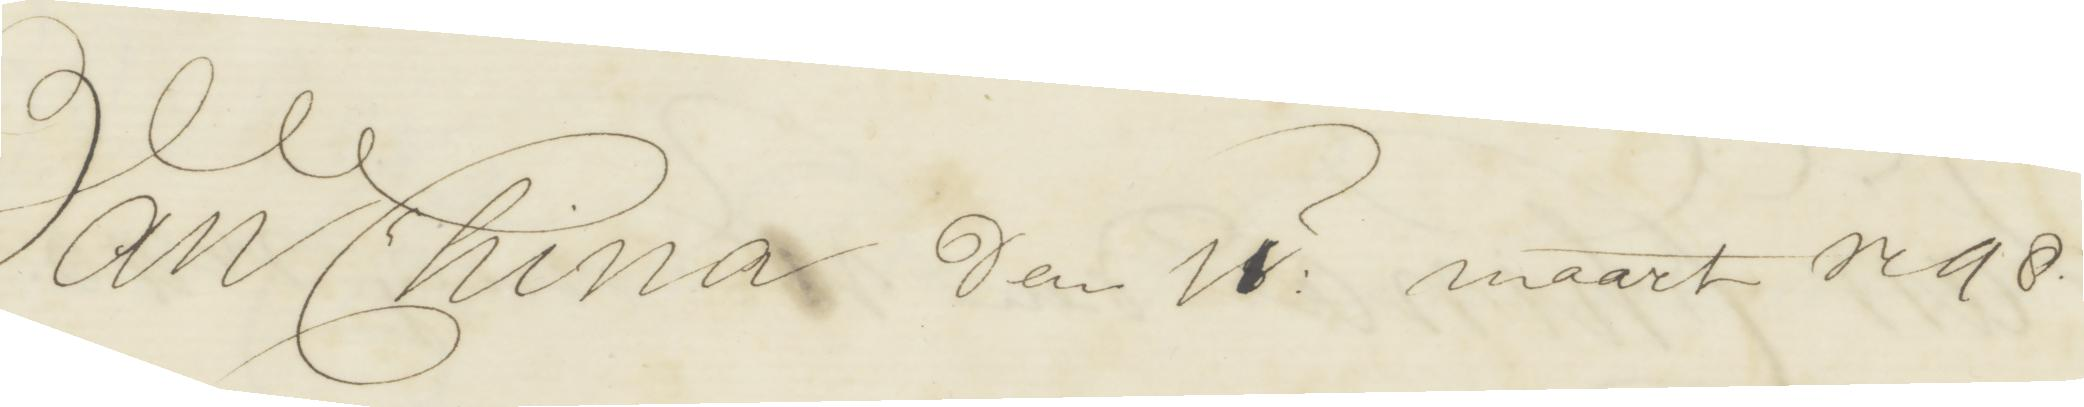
Van China den 11:' maart 1748.
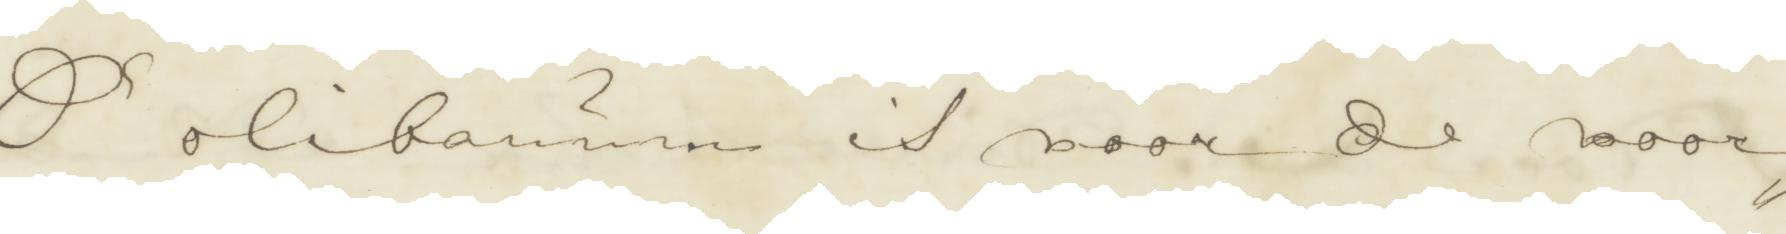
De olibanum is voor de voor„
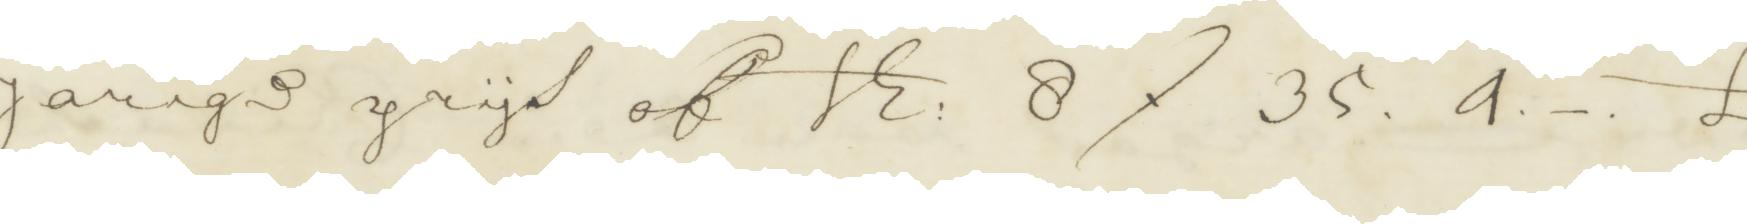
jarige prijs of th: 8 ƒ 35. 4.–. 't
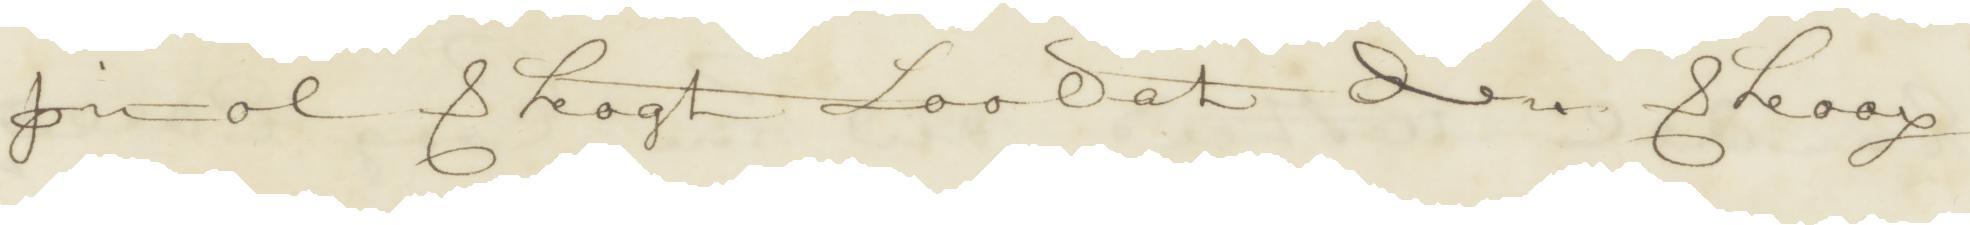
picol verkogt soodat den verkoop
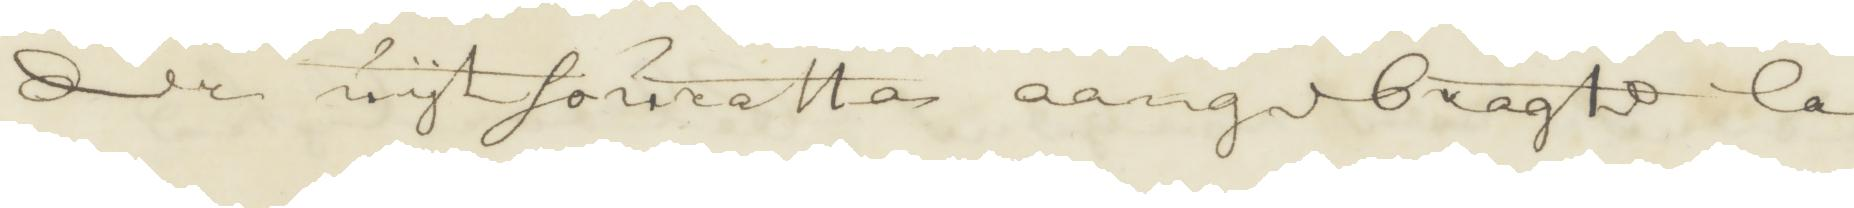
der uijt souretta aangebragte la
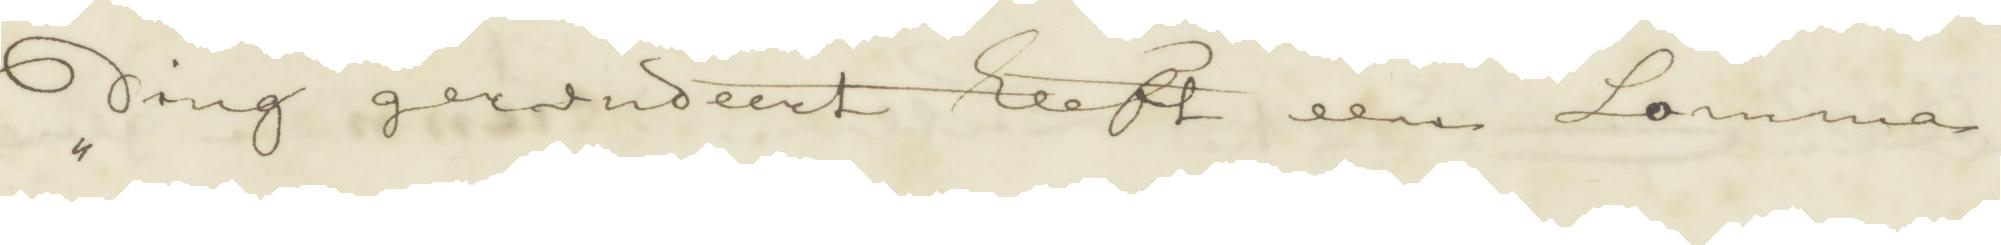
„ding gerendeert heeft een somma
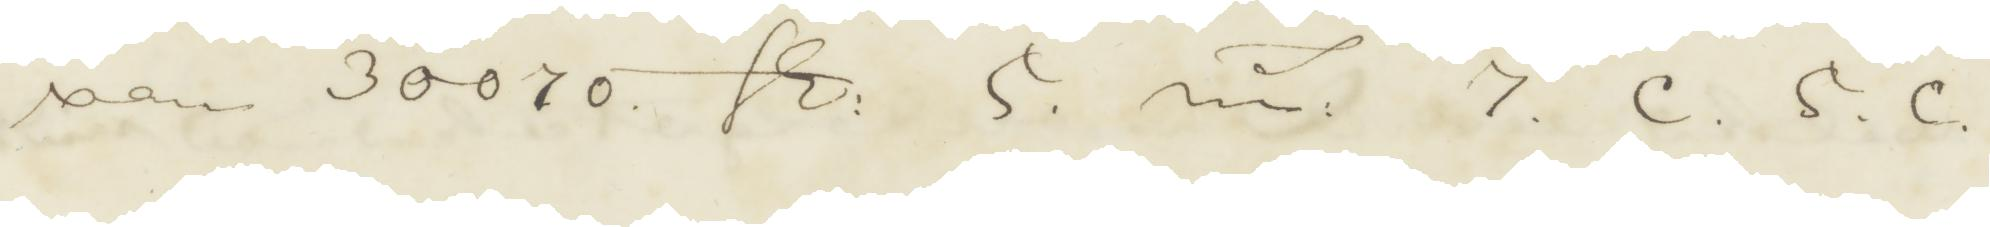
van 30070. th: 5. m:s 7. C. 5. C.
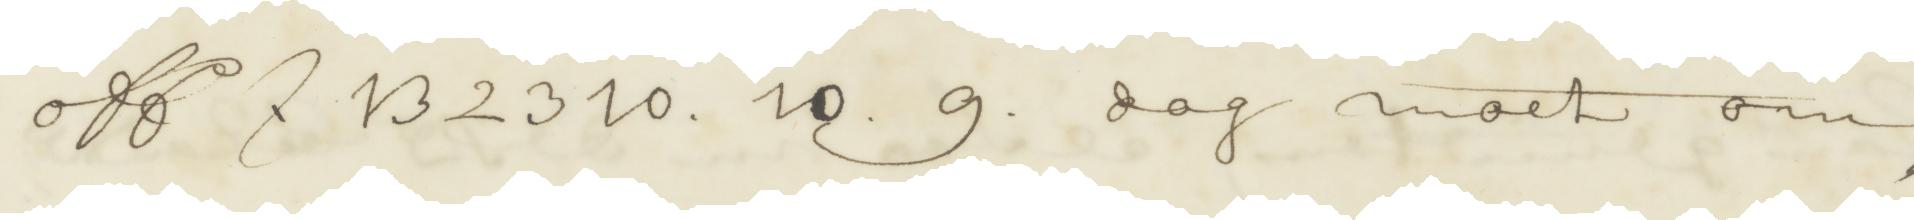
off ƒ 132310. 10. 9. dog moet om
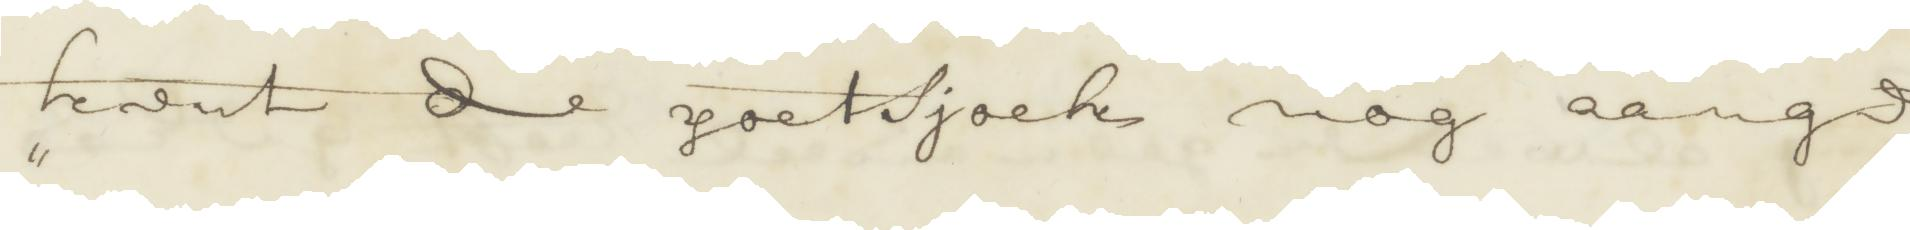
„trent de poetsjoek nog aange
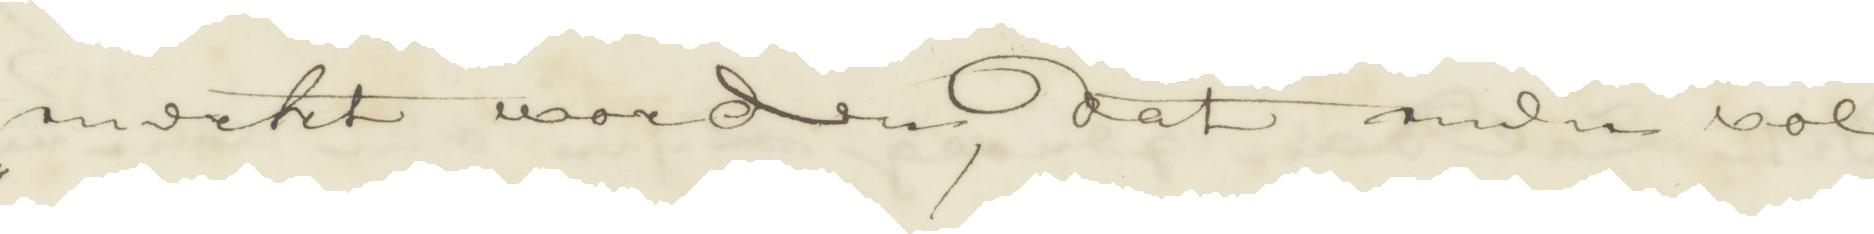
merkt worden, dat men vol
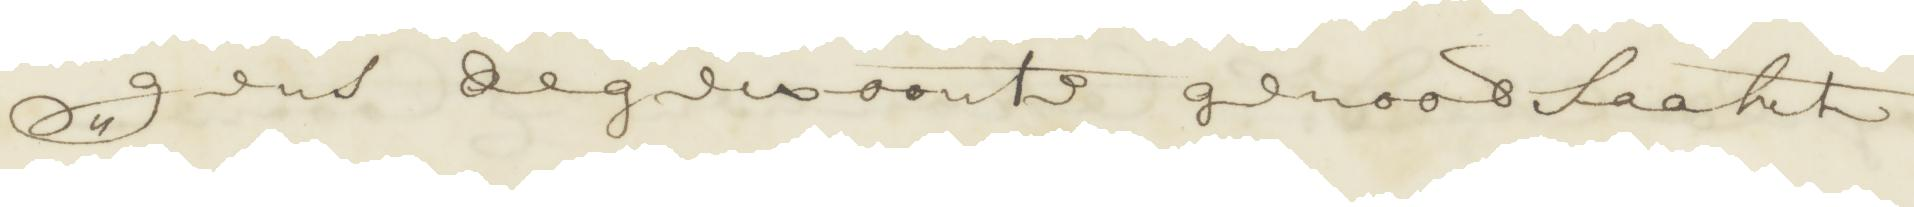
gens de gewoonte genoodsaakt
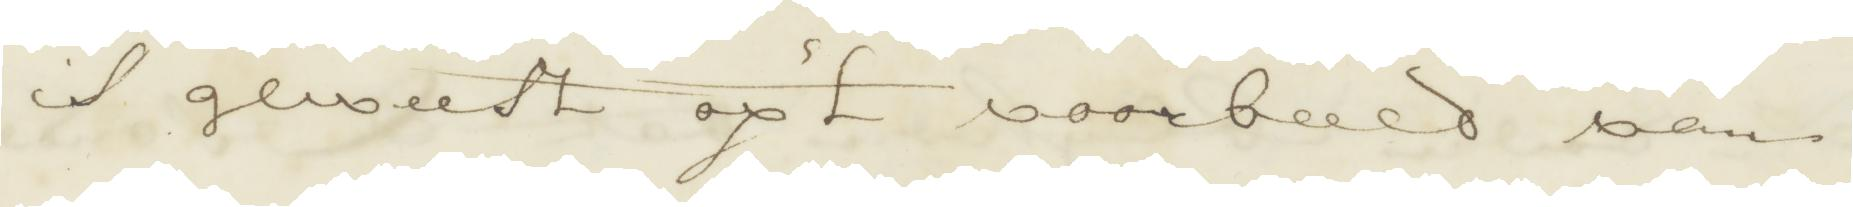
is geweest op 't voorbeeld van
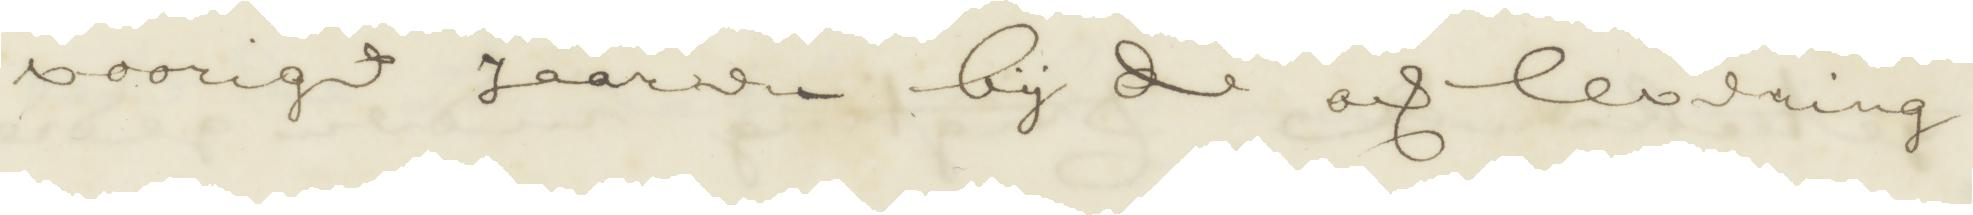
voorige jaaren bij de overlevering
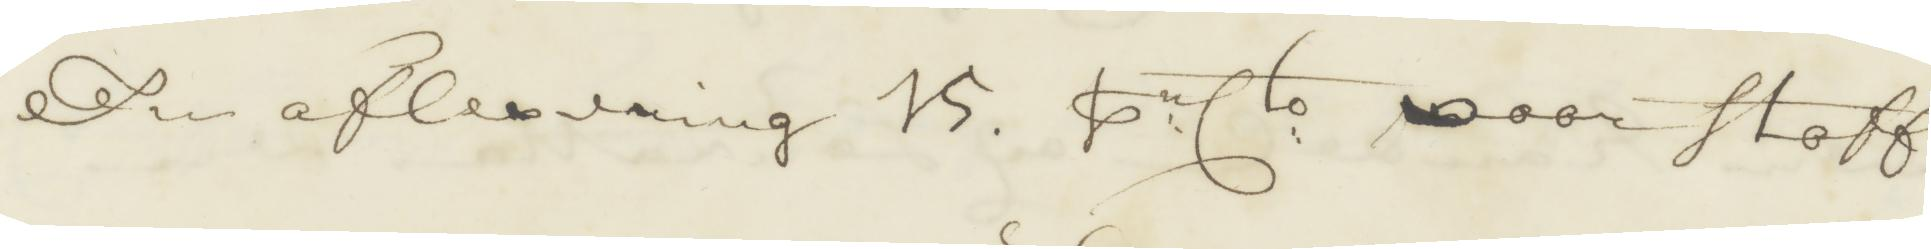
En aflevering 15. p:r C:to voor stoff
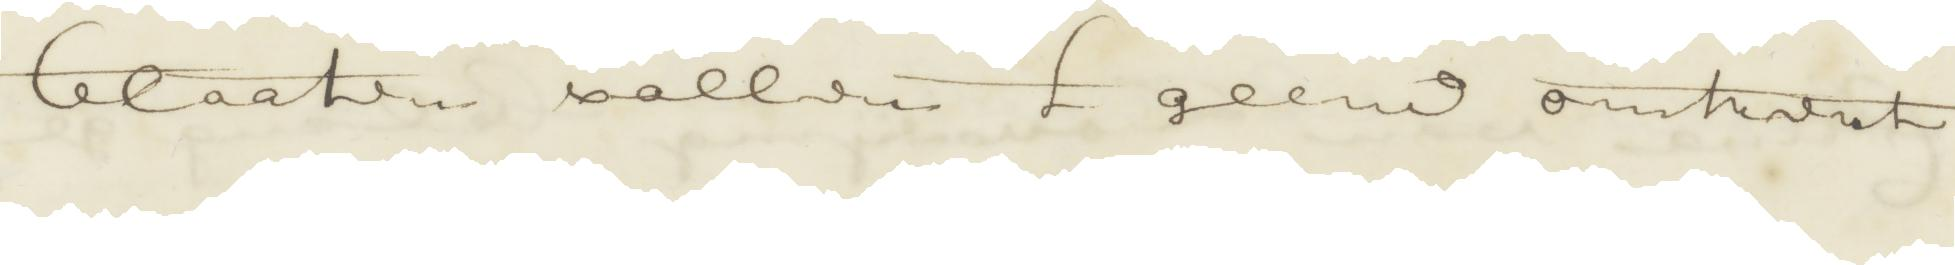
telaaten vallen 't geene omtrent
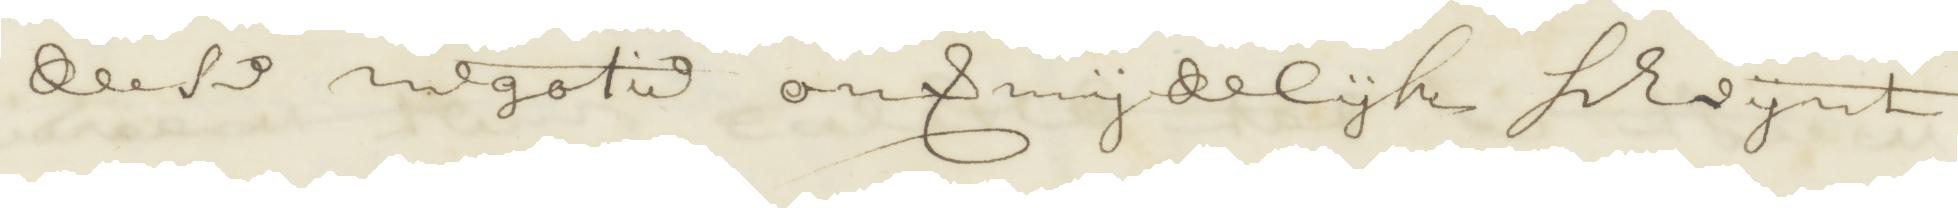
deese negotie onvermijdelijk scheijnt
